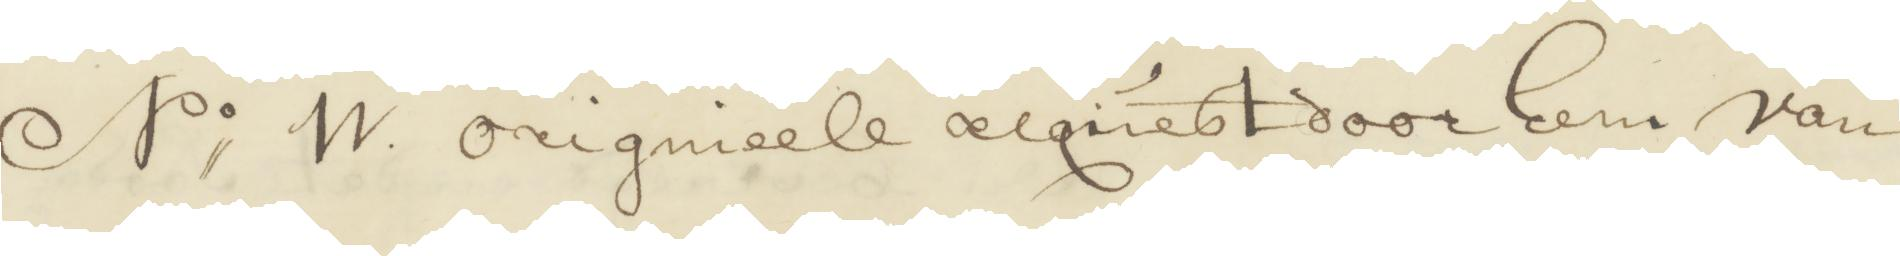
N„o 11. originieele request door hem van
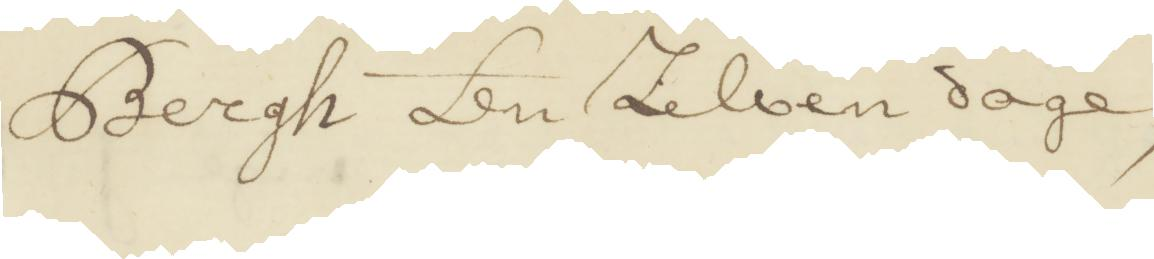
Bergh ten zelven dage,
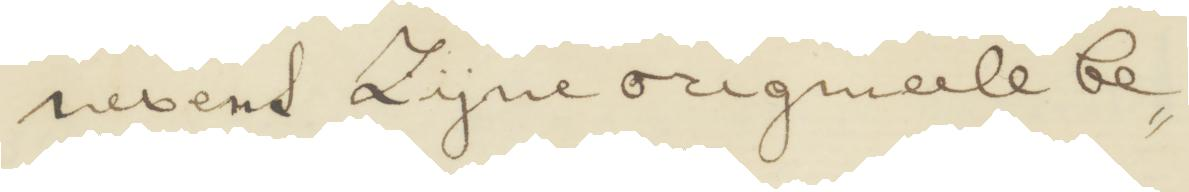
nevens zijne origineele be„
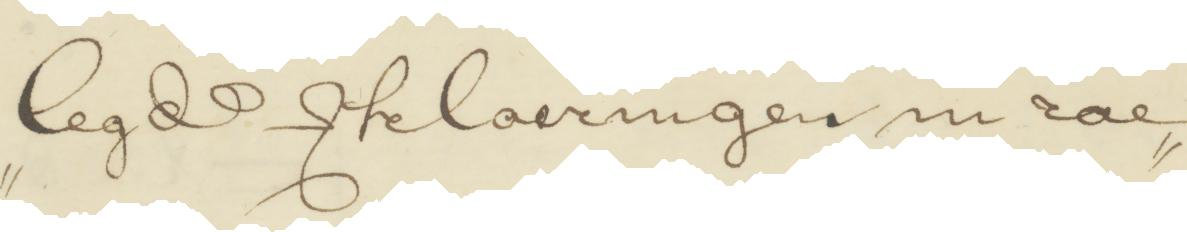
„legde verklaeringen, in rae„
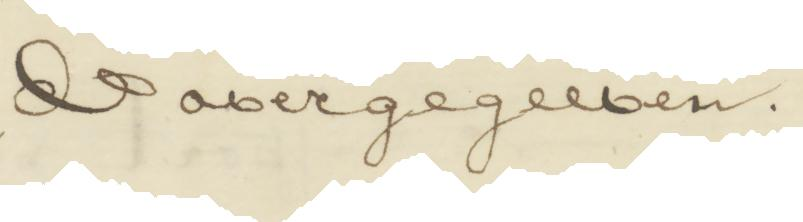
de overgegeeven.
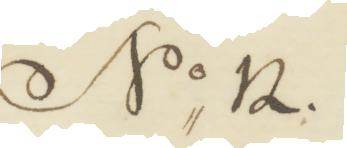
N„o 12.
